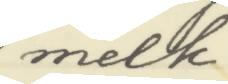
melk
